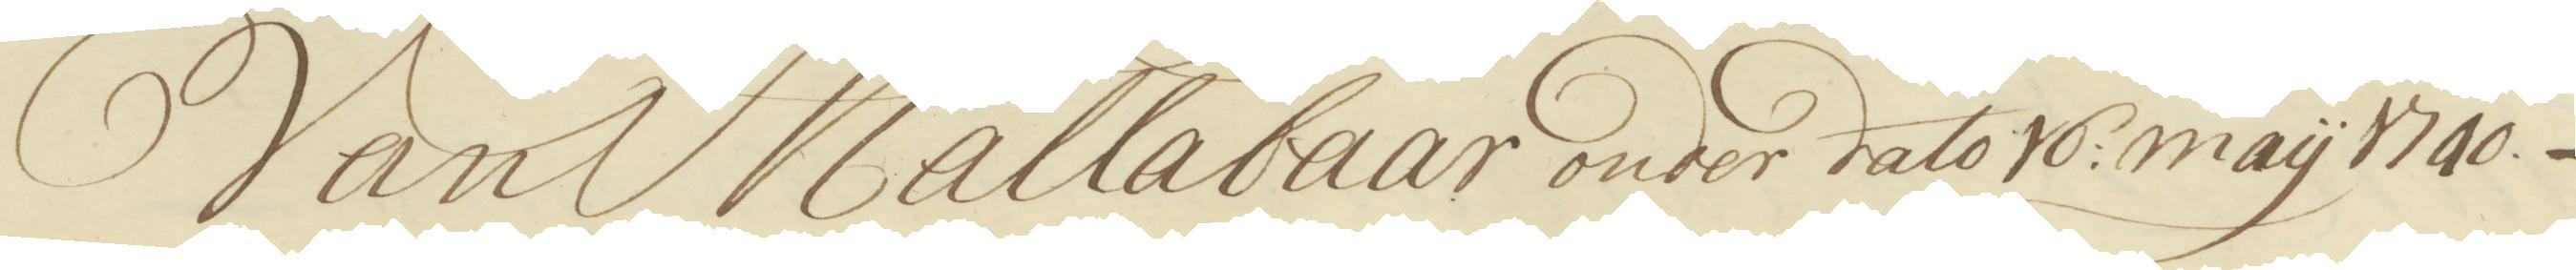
Van Mallabaar onder dato 16: maij 1740. -
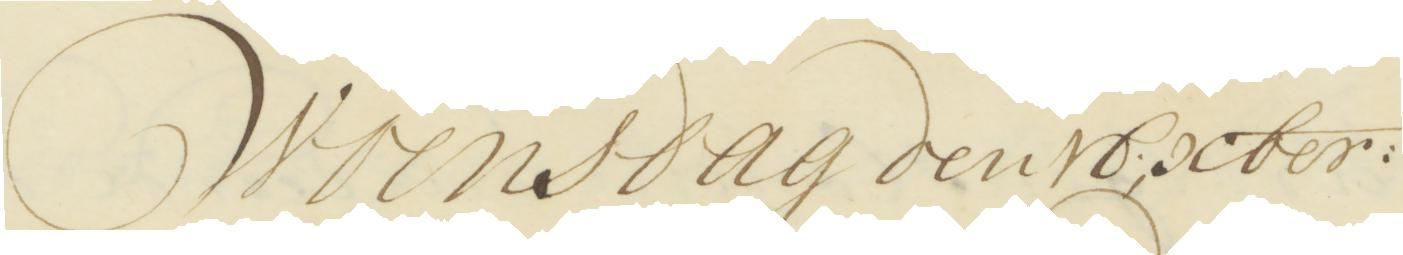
Woensdag den 16; xber:
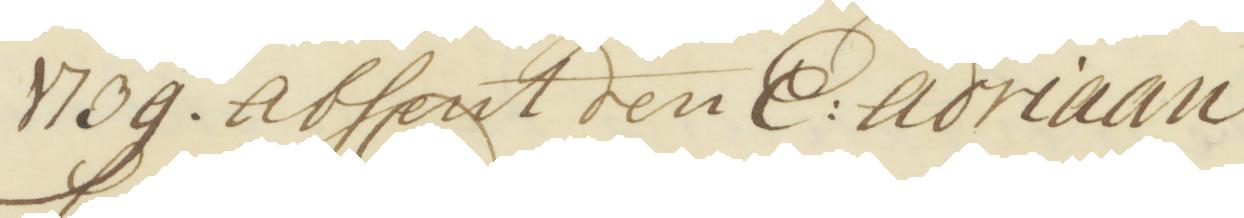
1739. absent den E: adriaan
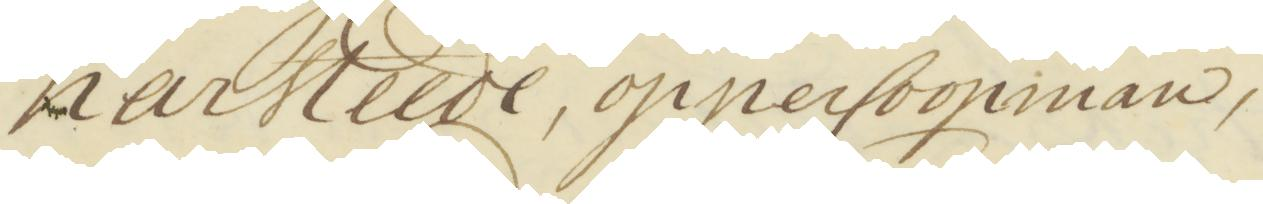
harsteede, oppercoopman,
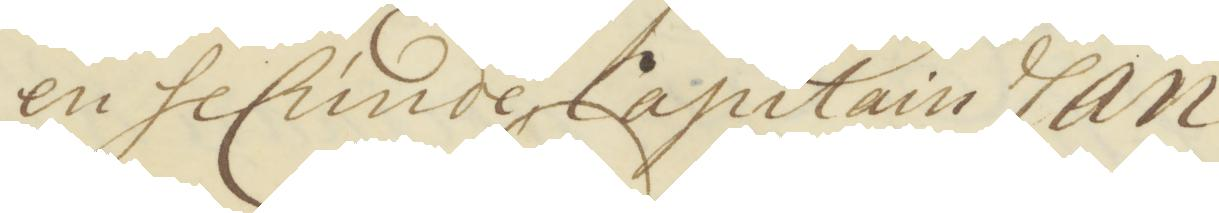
en secunde, capitain Jan
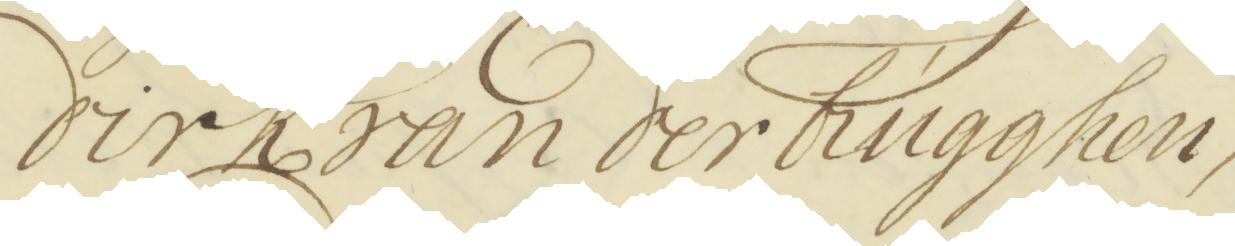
dirk van der brugghen,
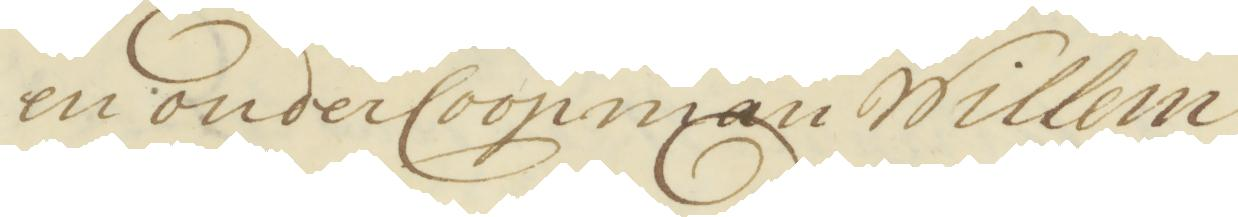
en ondercoopman willem
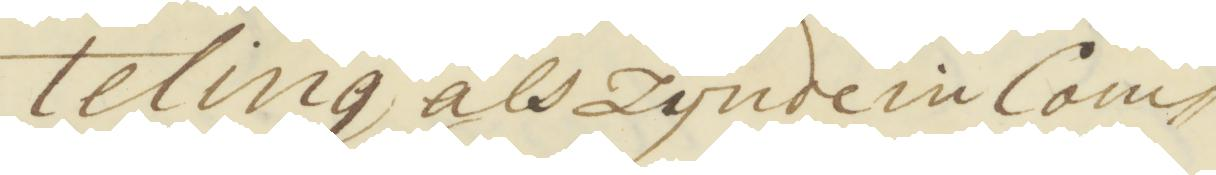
teling als zynde in Com
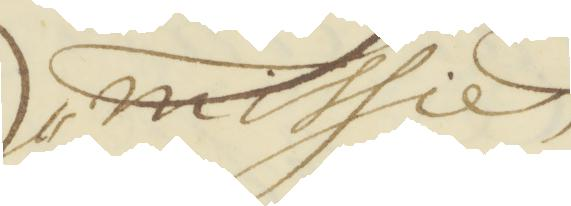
missie,
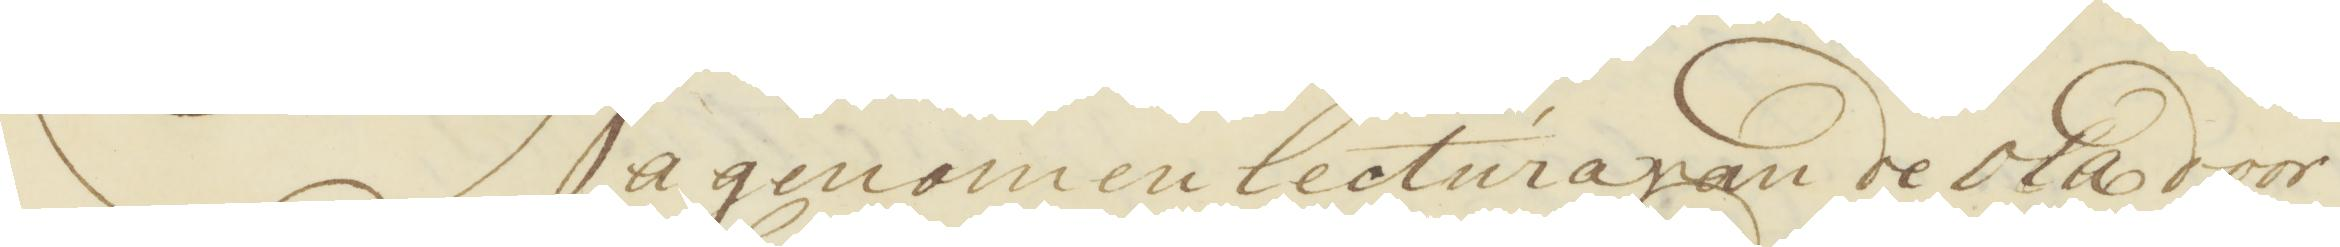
Nagenomen lectura van de ola door
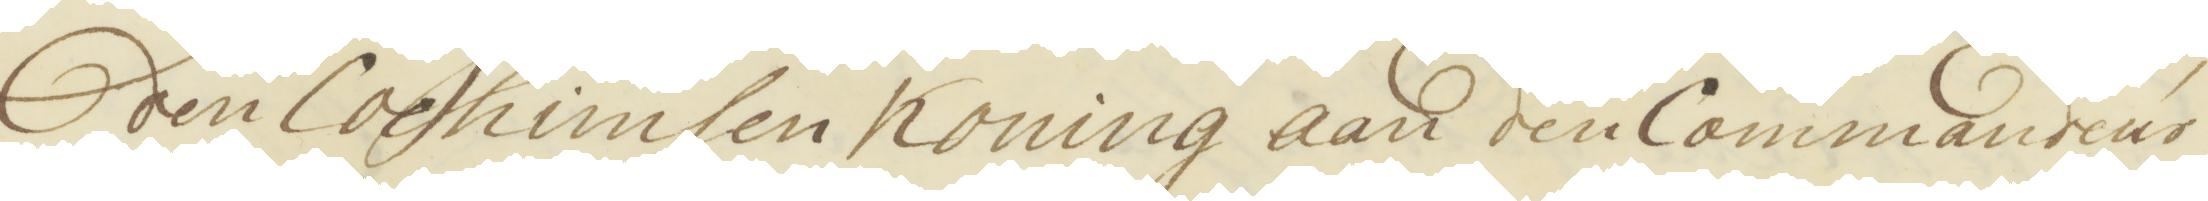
den Cochimsen Koning aan den Commandeur
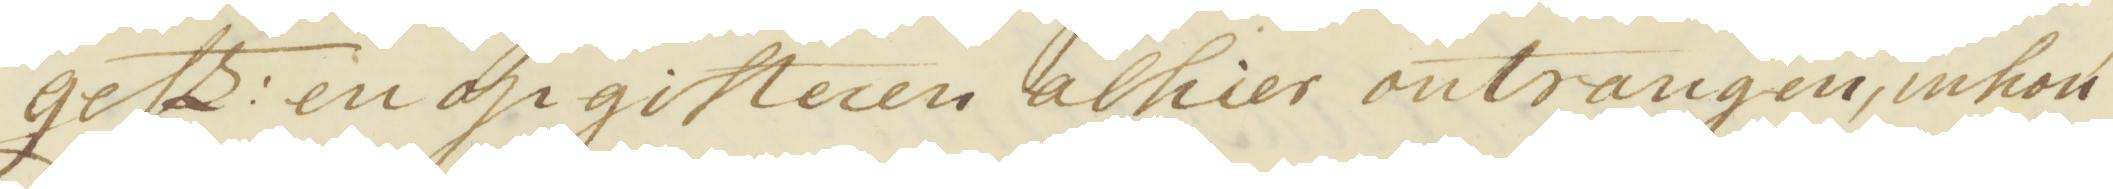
gesz: en op gisteren alhier ontvangen, inhou
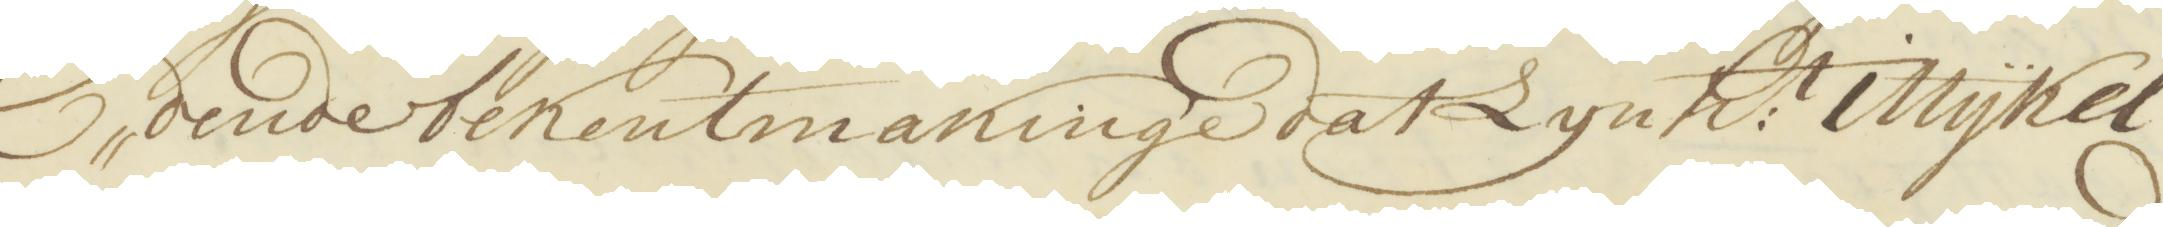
„dende bekentmakinge dat zyn h:t ittijkel
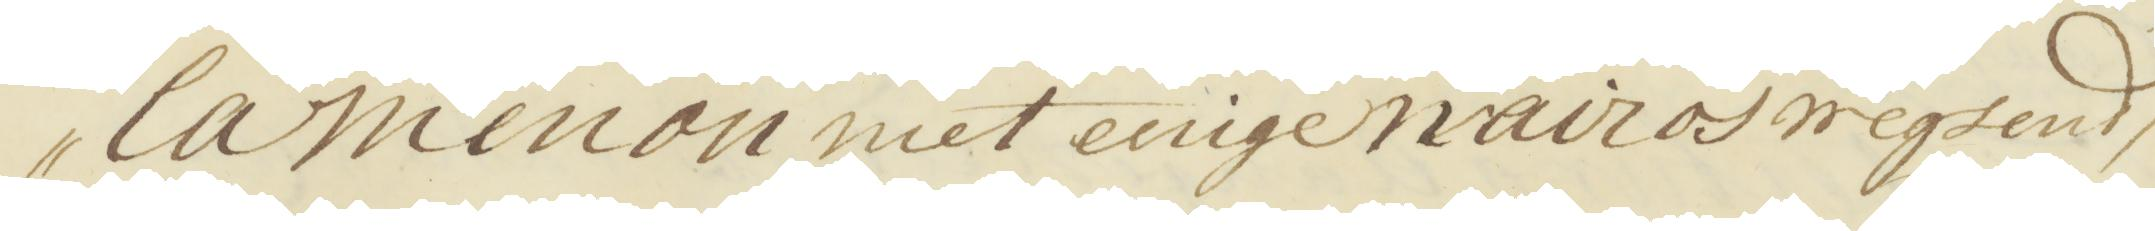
„la menon met enige wairos wegsend,
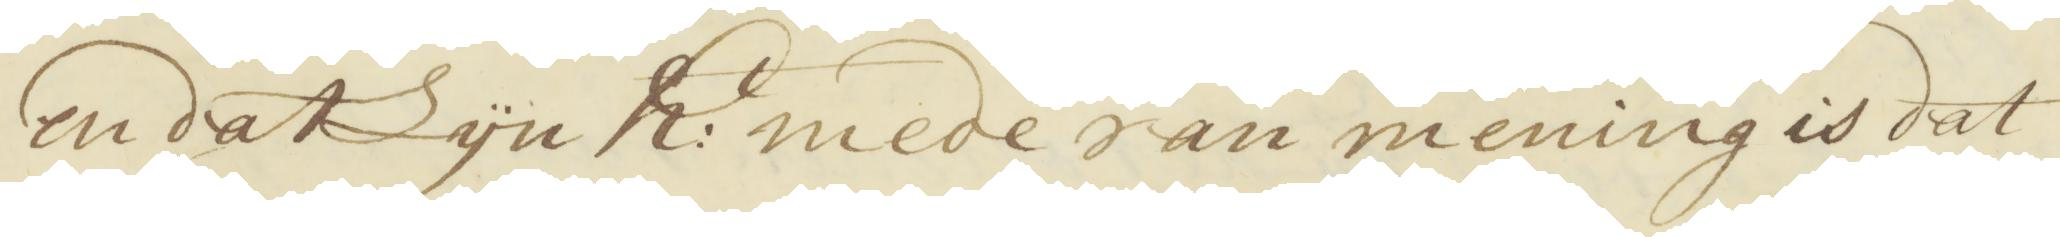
en dat zijn h:t mede van mening is dat
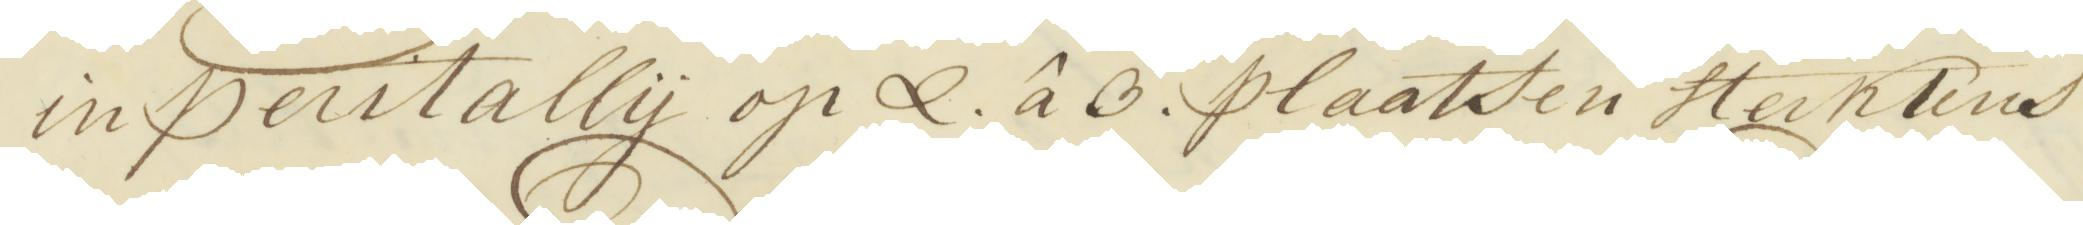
in peritallij op 2. â 3. plaatsen sterktens
